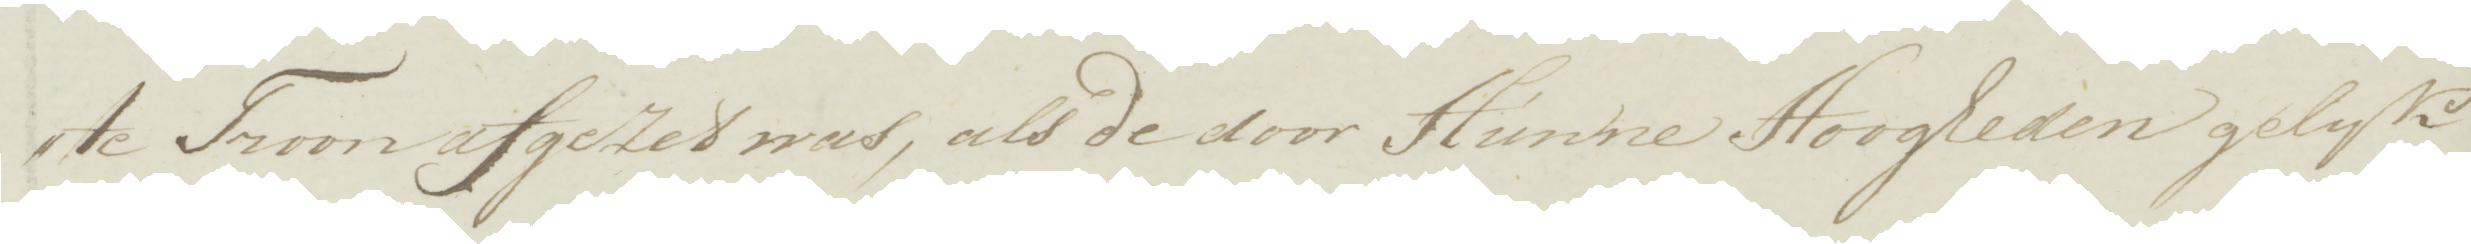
„te Troon afgezet was, als de door Hunne Hoogheden gelyk
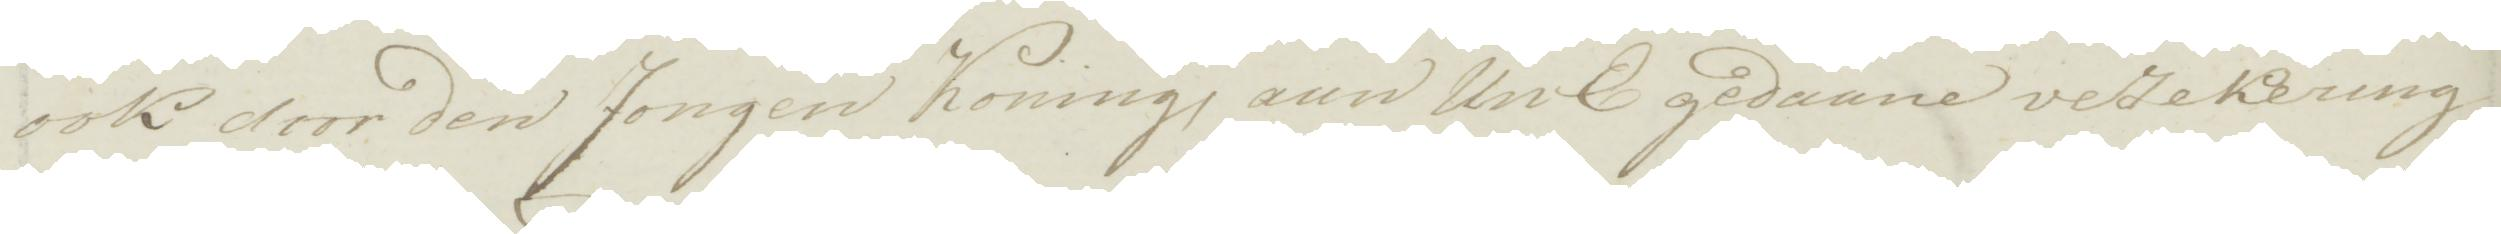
ook door den Jongen Koning, aan Uw E gedaane vezekering
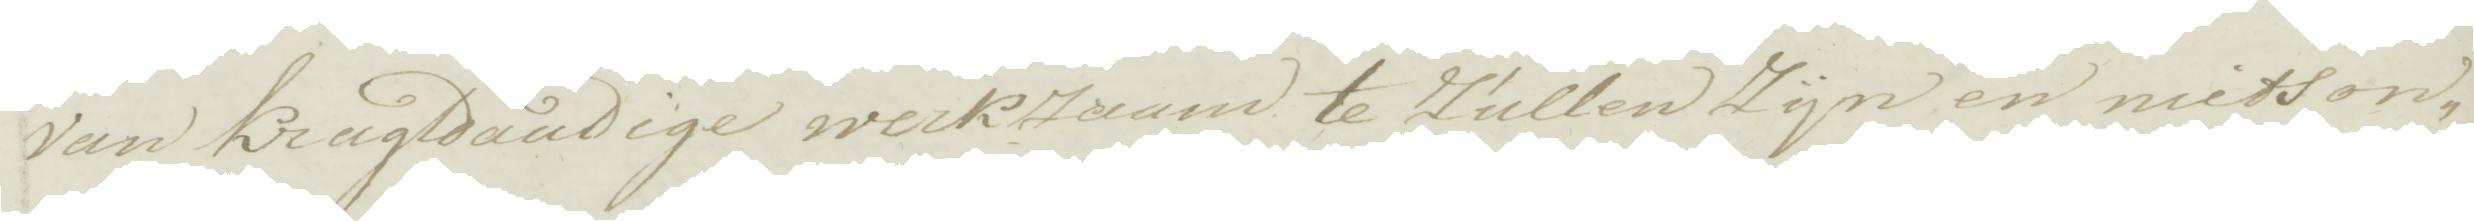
van kragtdaadige werkzaam te Zullen Zijn en niets on„
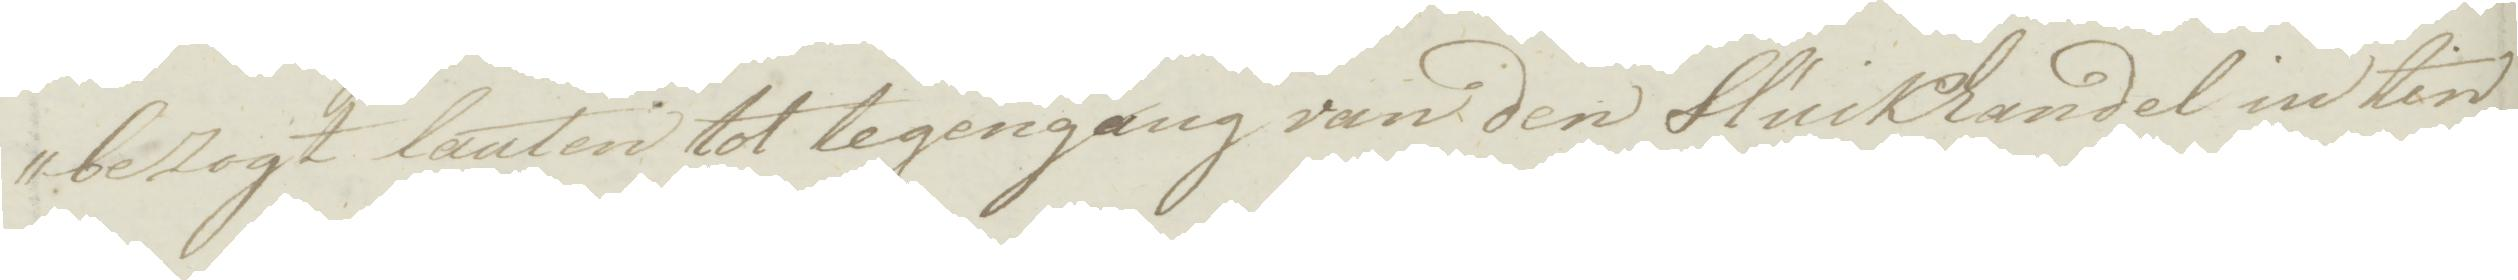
„bezogt laaten tot tegengang van den Sluikhandel in tin
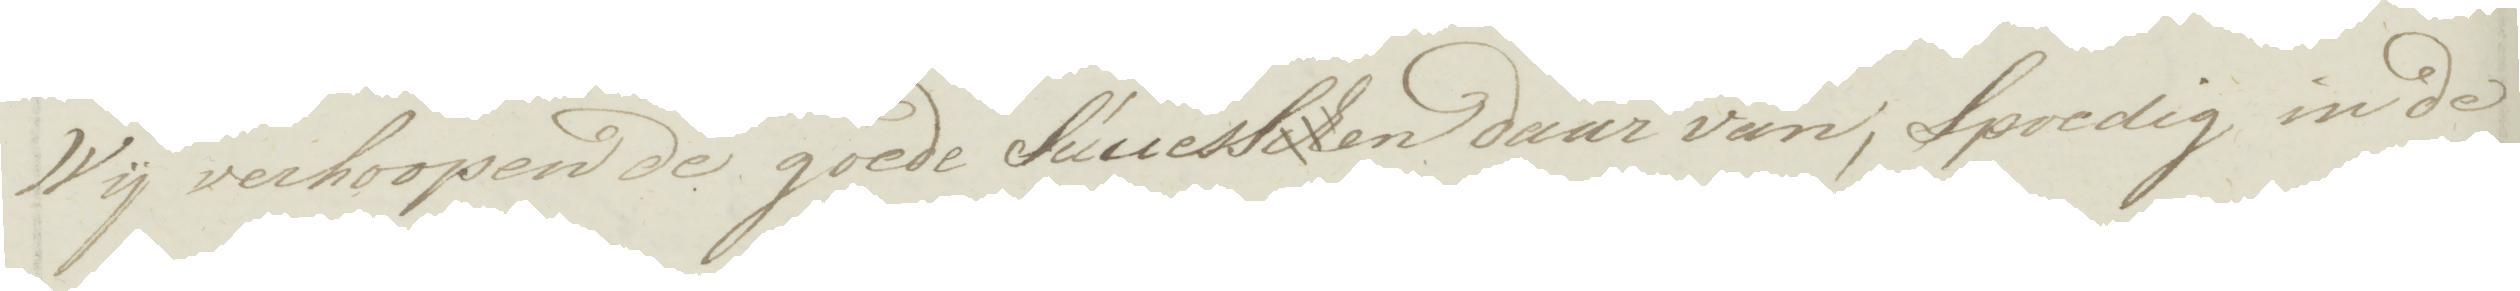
Wij verhoopen de goede successchen daar van, Spoedig in de
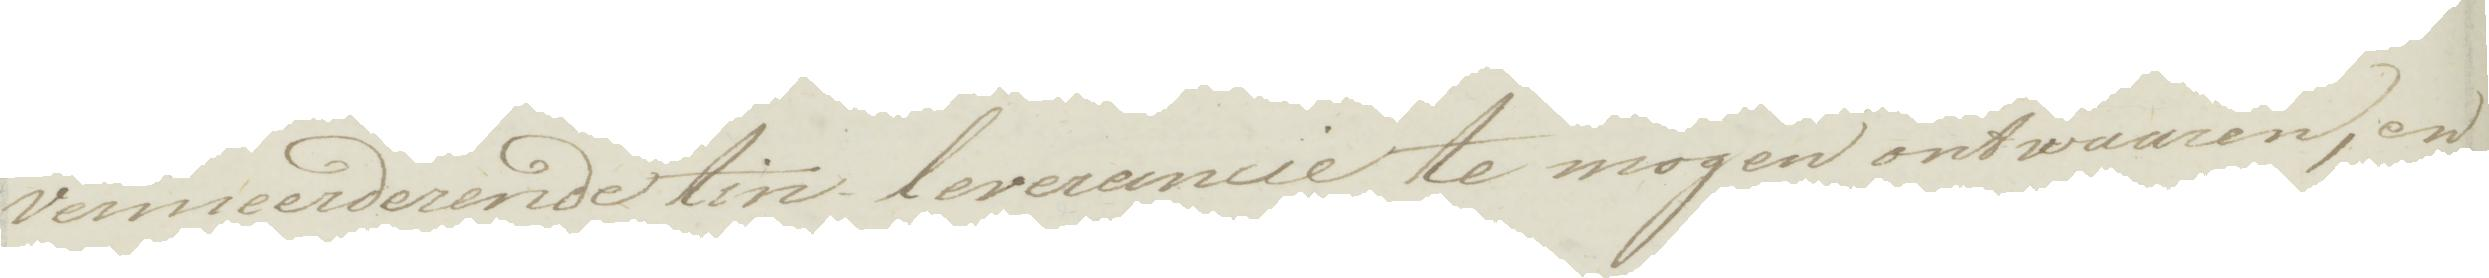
vermeerderende tin leverancie te mogen ontwaaren, en
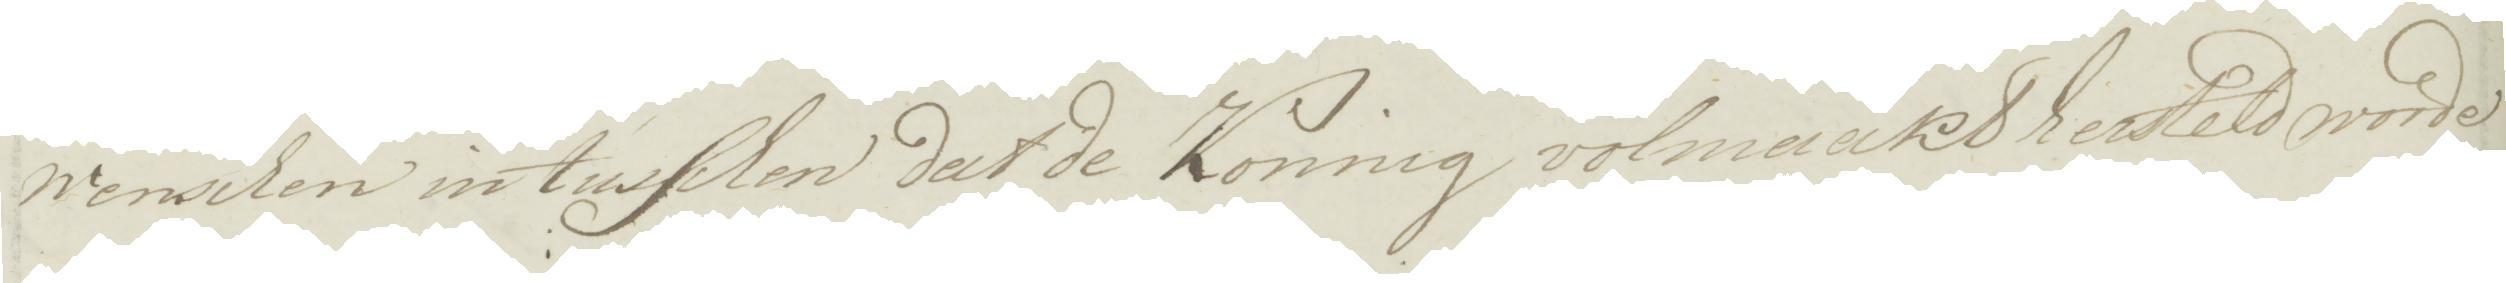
wenschen in tusschen dat de Koning volmaakt hersteld worde
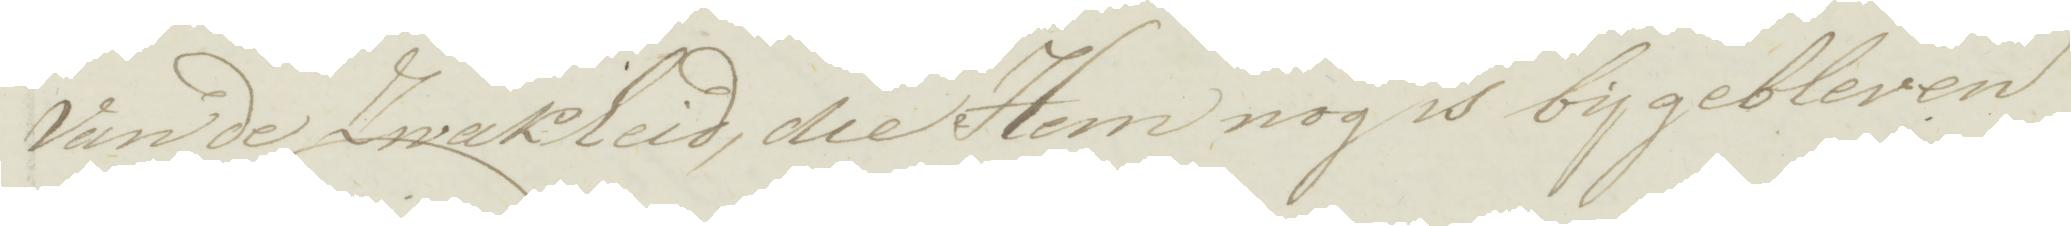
van de Zwakheid, die Hem nog is bij gebleven
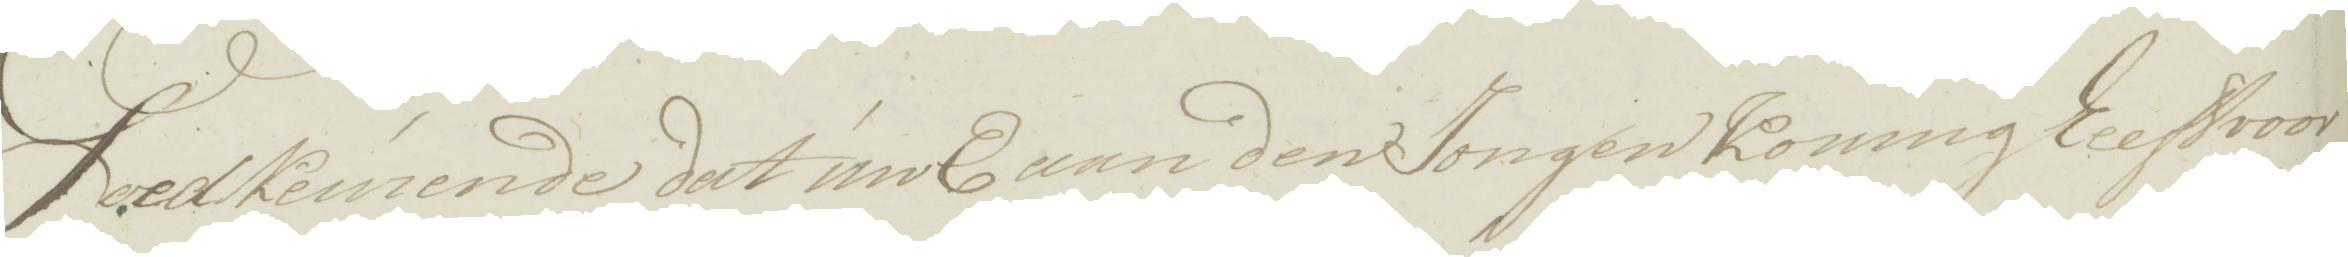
Goedkeurende dat uw E aan den Jongen Koning heeft voor
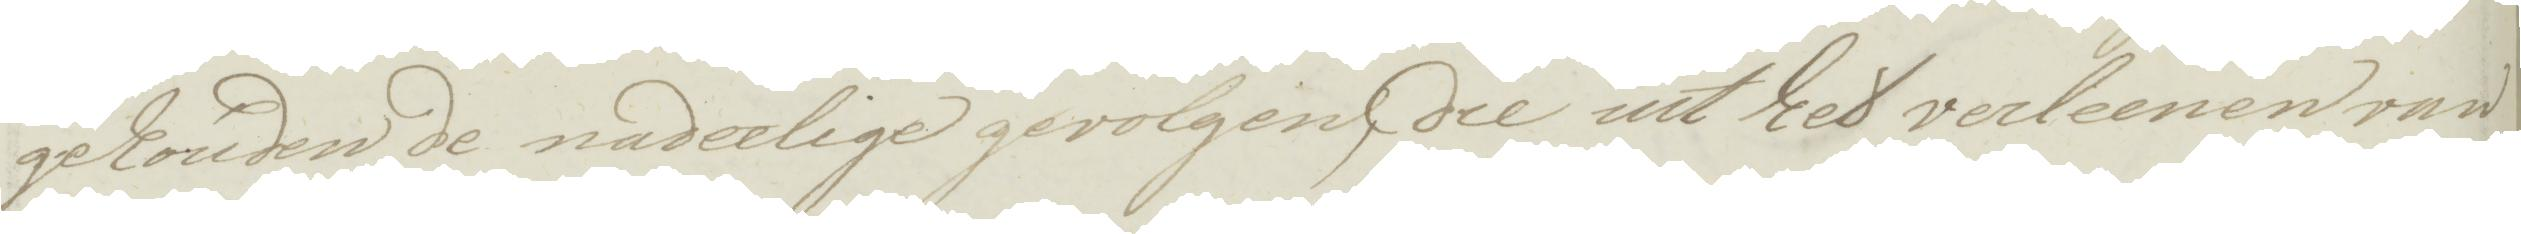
gehouden de nadeelige gevolgen die uit het verleenen van
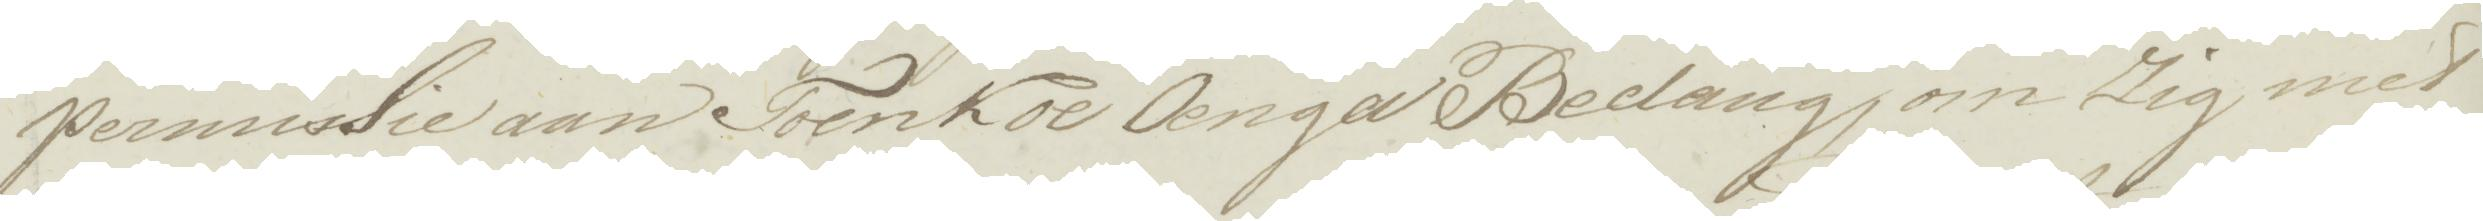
permissie aan Toenkoe Oenga Bedang, om Zig met
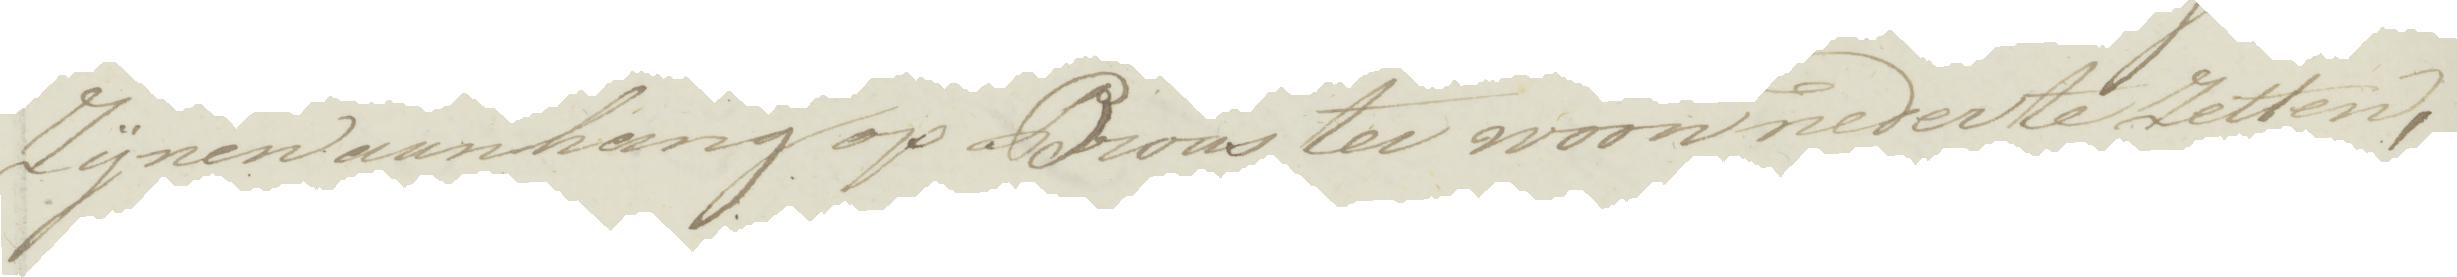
Zijnen aanhang op Broas ter woon neder te Zetten,
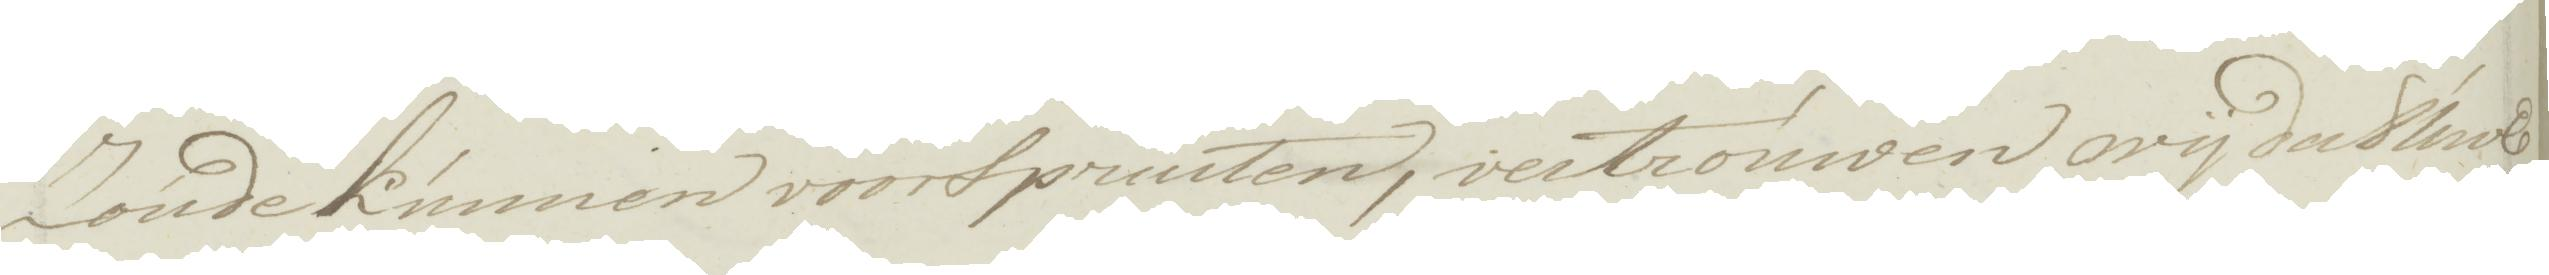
Zoude kunnen voorspruiten, vertrouwen wij dat Uw Ed
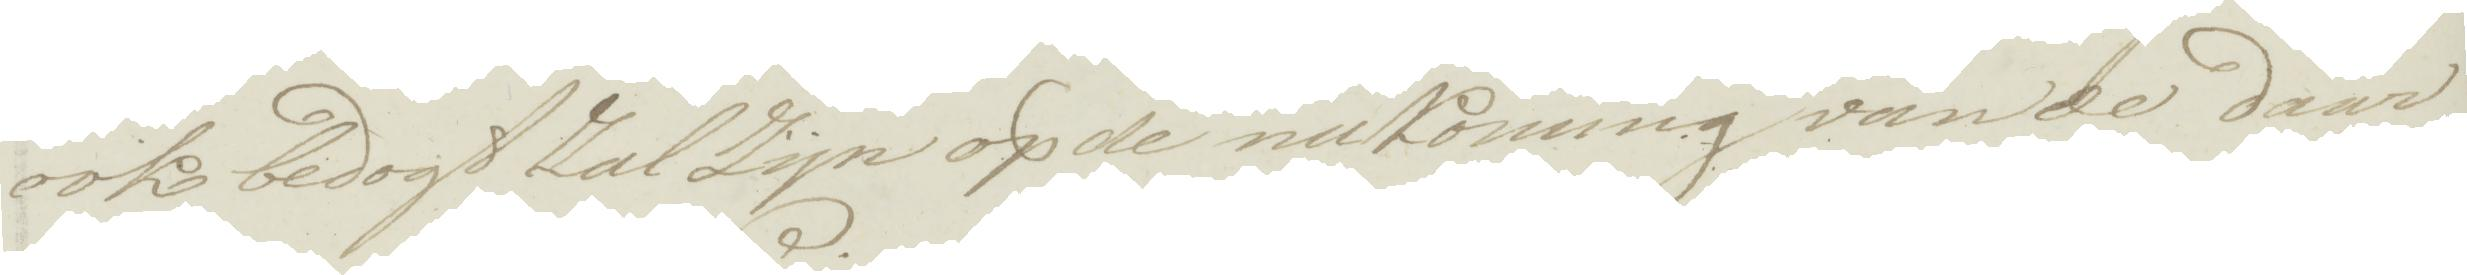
ook bedogt Zal Zijn op de nakoming van de daar
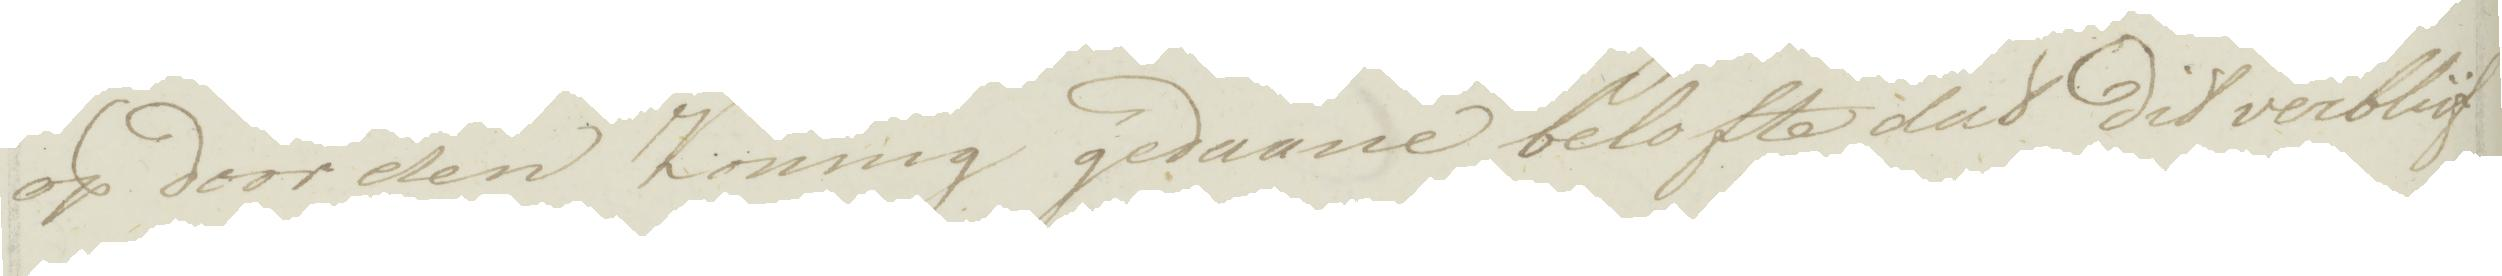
op door den Koning gedaane belofte dat dit verblijf
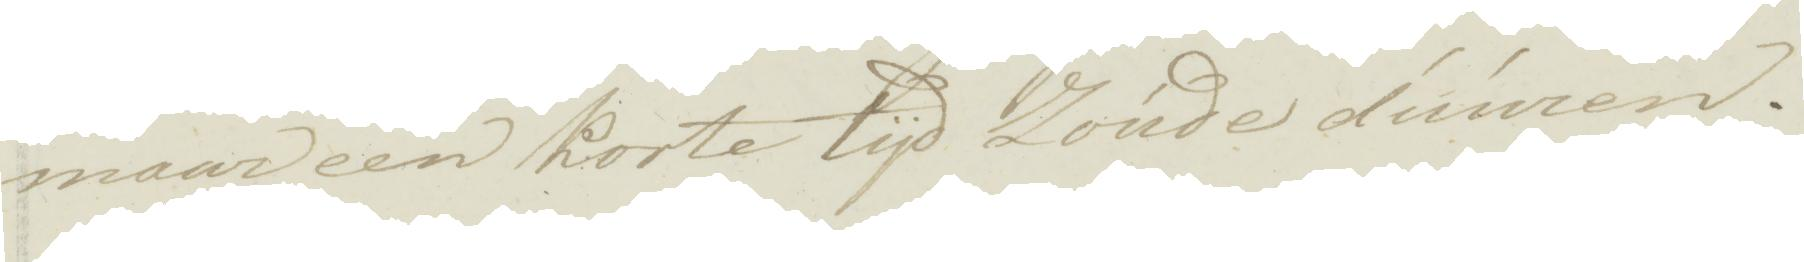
maar een korte tijd Zoude duuren.
